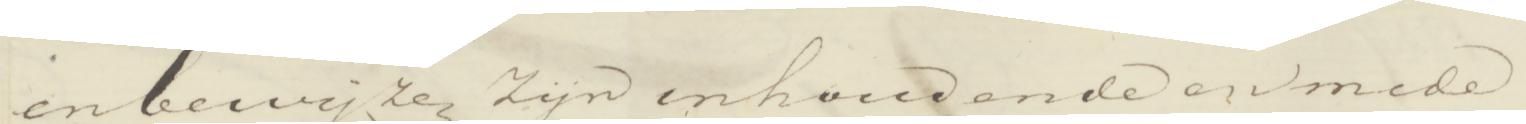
en bewijzen zijn inhoudende en mede
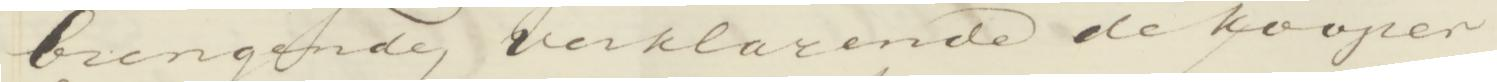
brengende, verklarende de kooper
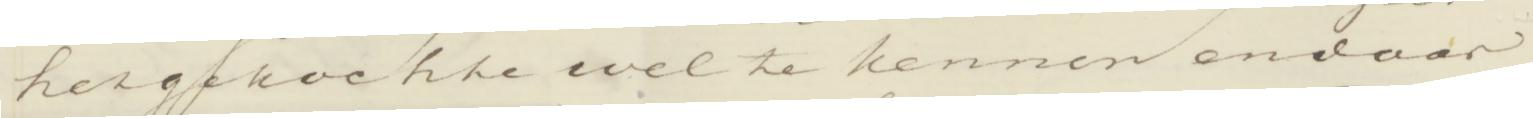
het gekochte wel te kennen en daar
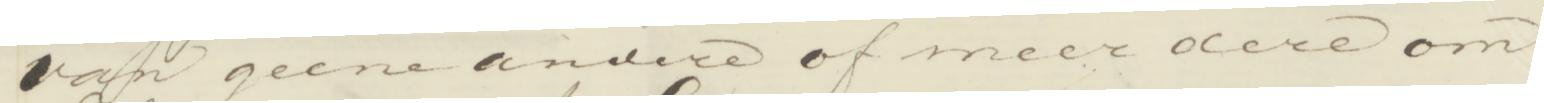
van geene andere of meer dere om
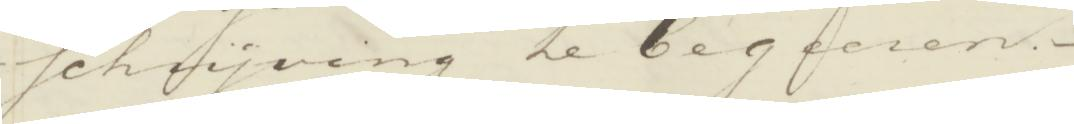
schrijving te begeeren.
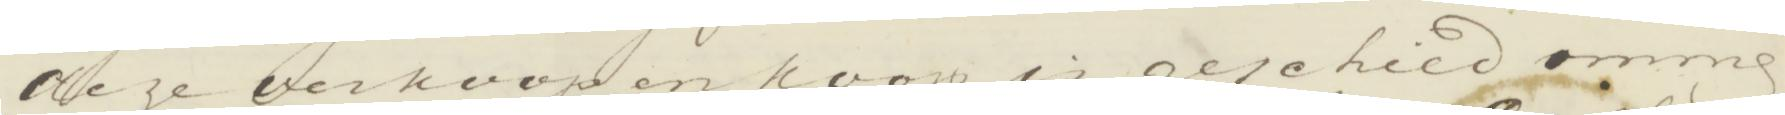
deze verkoop en koop is geschied omme
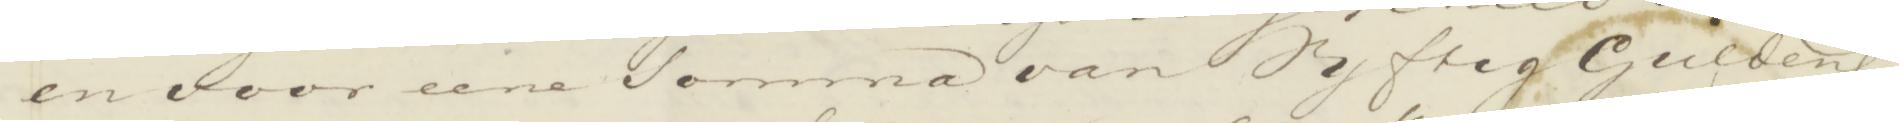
en voor eene somma van Vyftig Guldens
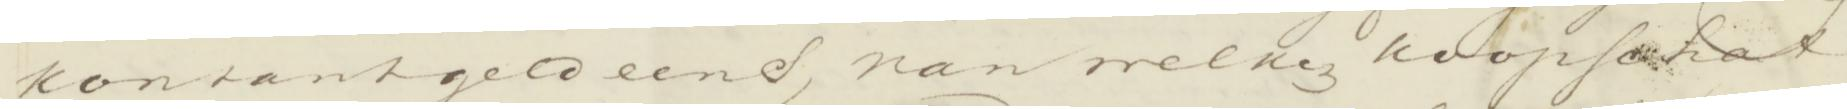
kontant geld eens, van welke koopschat
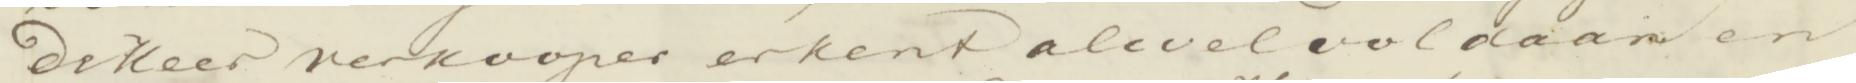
de Heer verkooper erkent alwel voldaan en
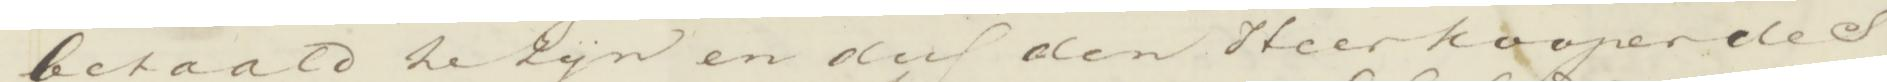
betaald te zijn en dus den Heer kooper des
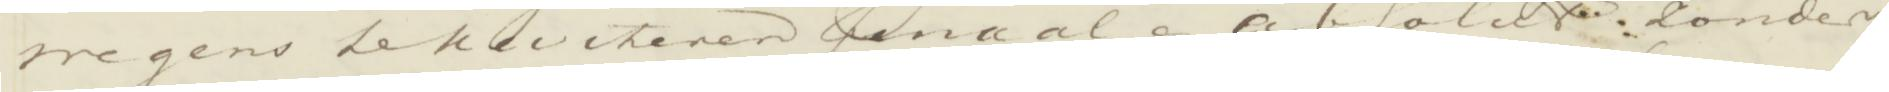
wegens te kwiteren finaal en absolut zonder
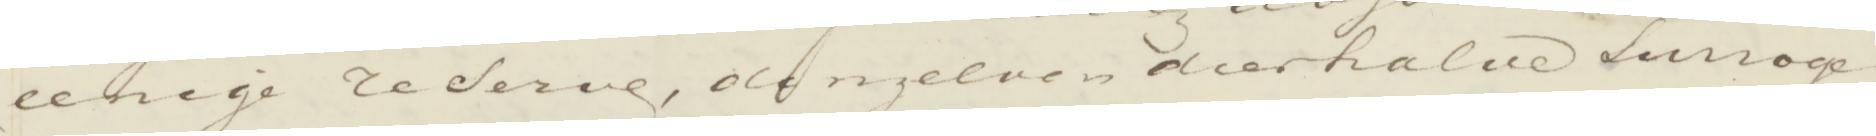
eenige reserve, denzelven dierhalve surroge
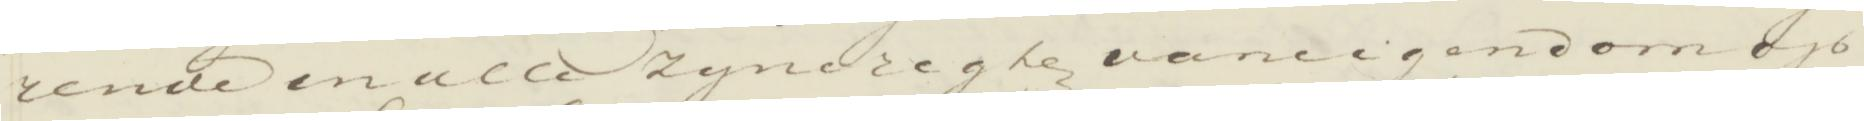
rende in alle zyne regten van eigendom op
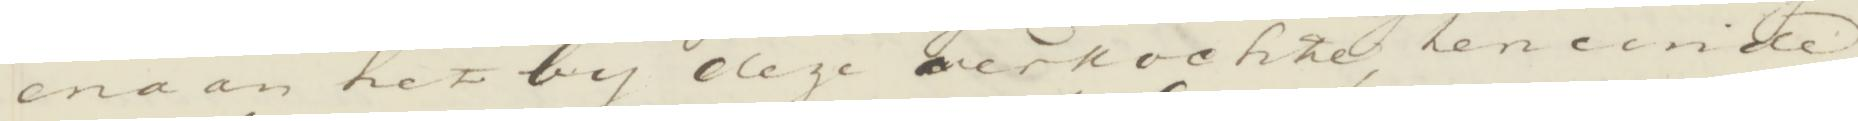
en aan het by deze verkochte ten einde
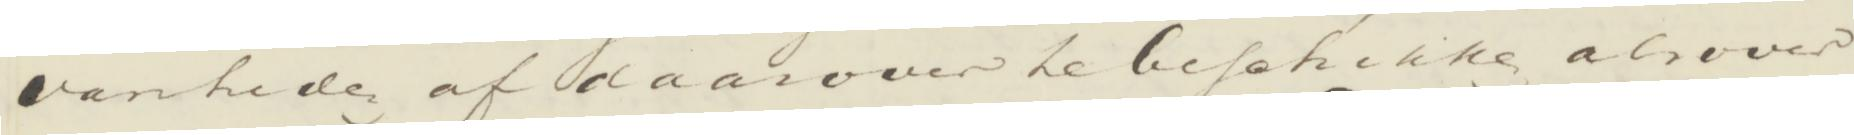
van heden af daarover te beschikken als over
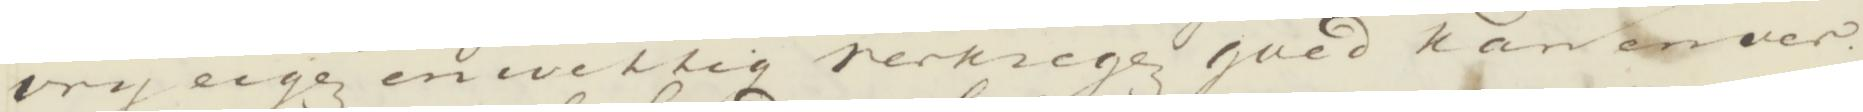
vry eigen en wettig verkregen goed kan en ver.
